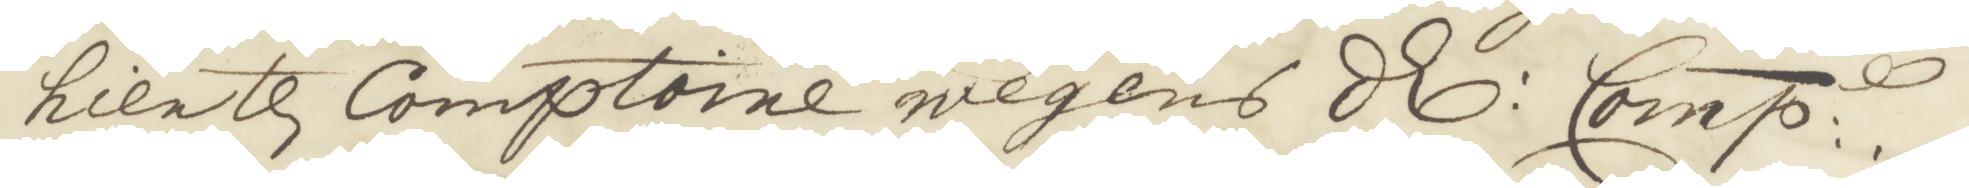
hier ten Comptoire wegens dE: Comp:e
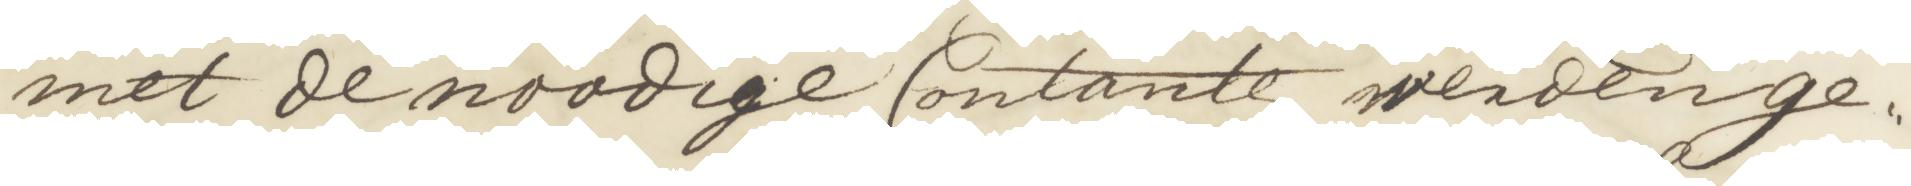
met de noodige Contante werden ge„
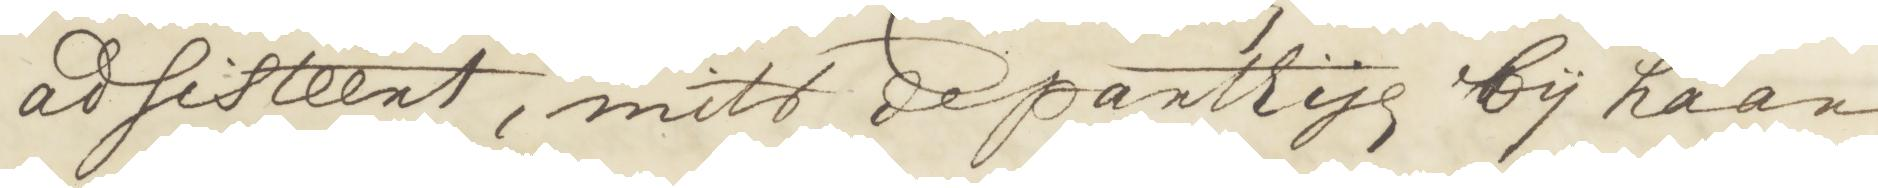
adsisteert, mits de parthijen bij haar
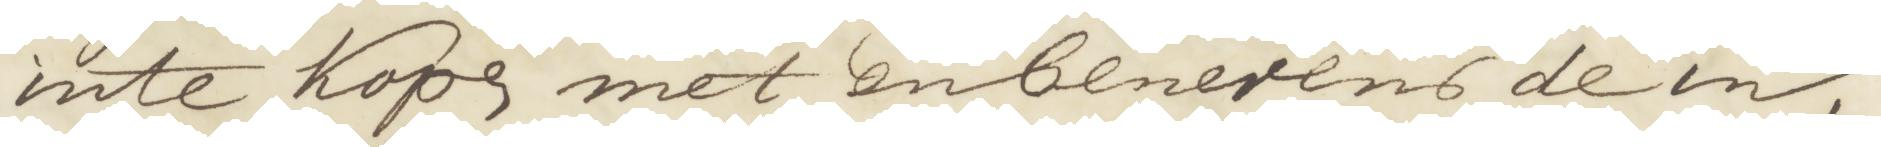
inte kopen met en benevens de in„
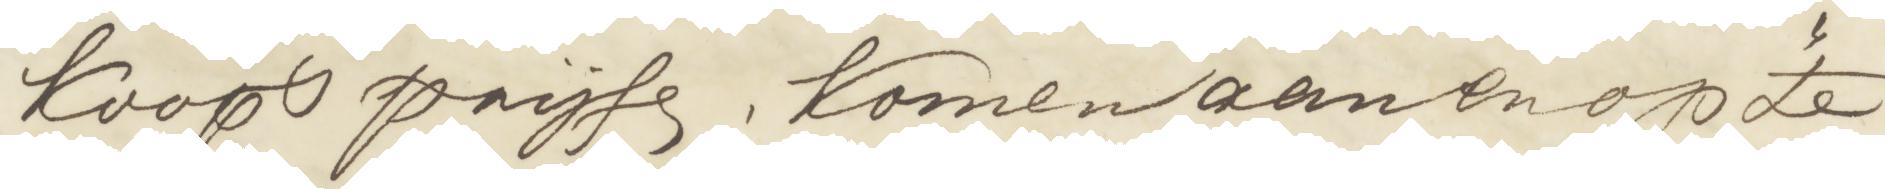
koops prijsen, komen aan en op te
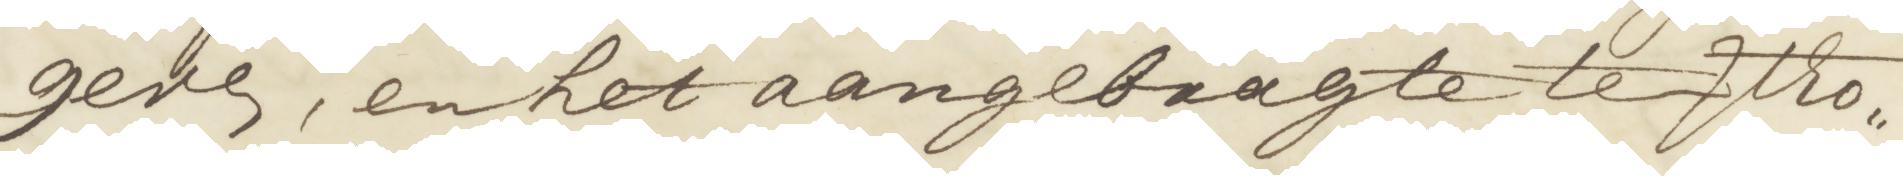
geven, en het aangebragte te vertho„
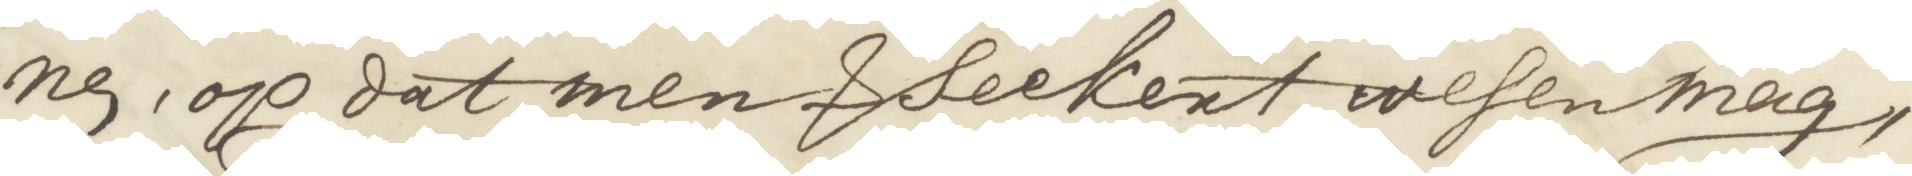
nen, op dat men verseekert wesen mag,
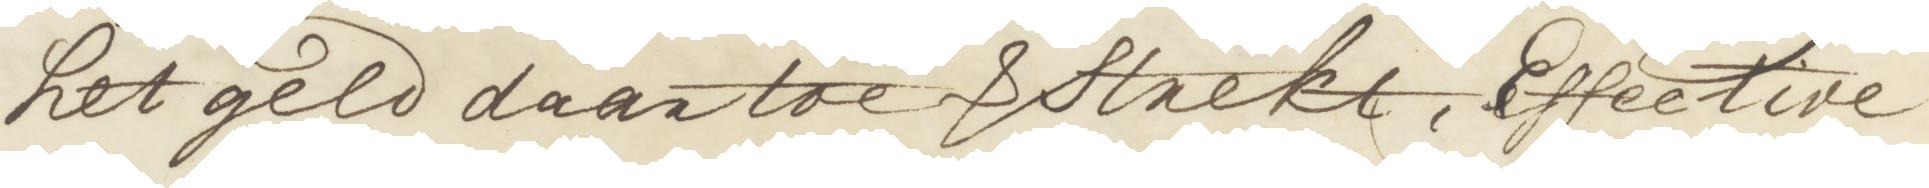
het geld daar toe verstrekt, Effective
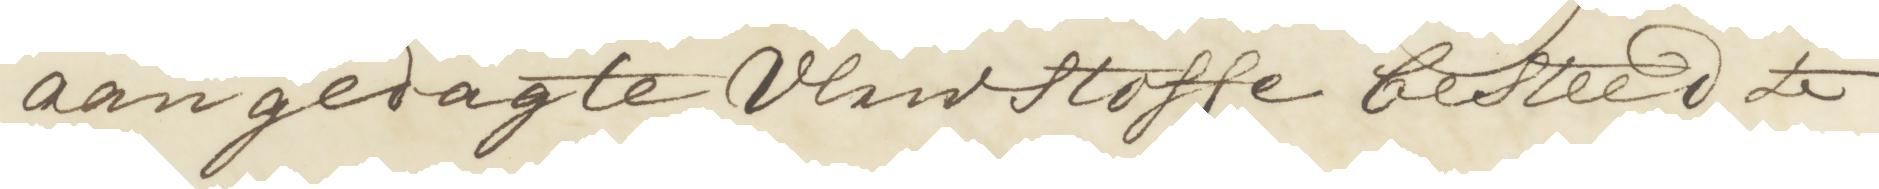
aan gedagte verwstoffe besteed te
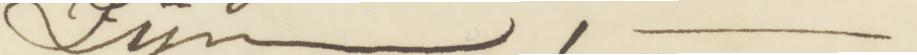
zijn, —
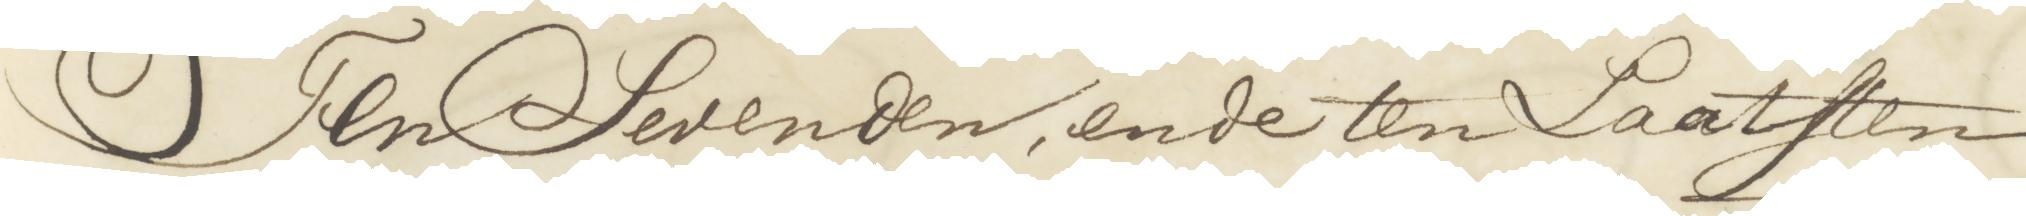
Ten Sevenden, ende ten Laatsten
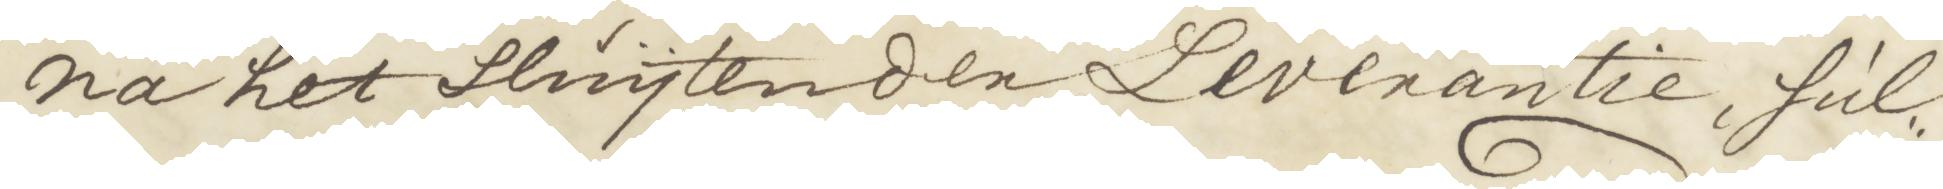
na het sluijten der Leverantie, sul„
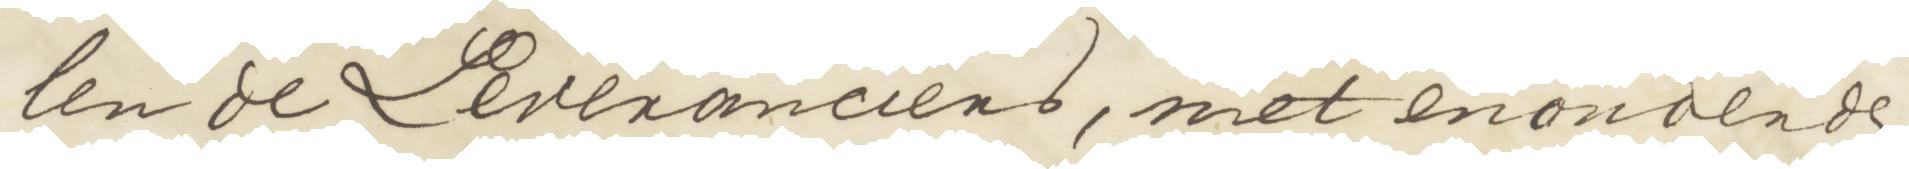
len de Leveranciers, met en onder den
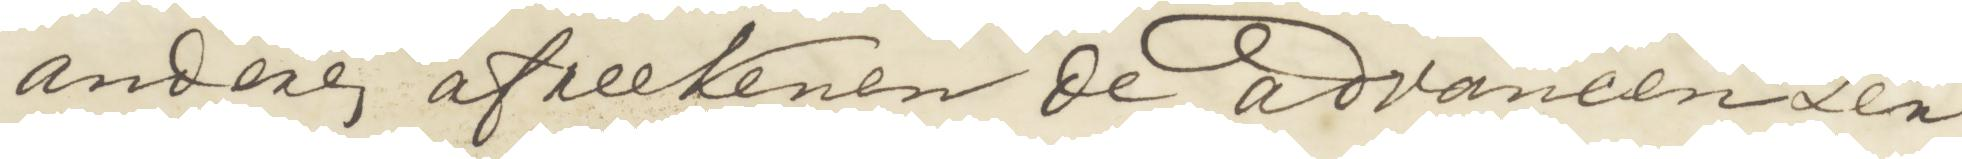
anderen afreekenen de advancen ter
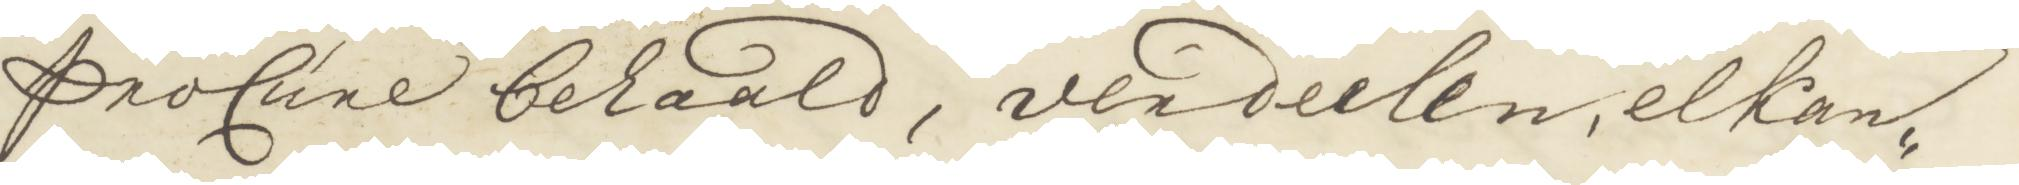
procure behaald, verdeelen, elkan„
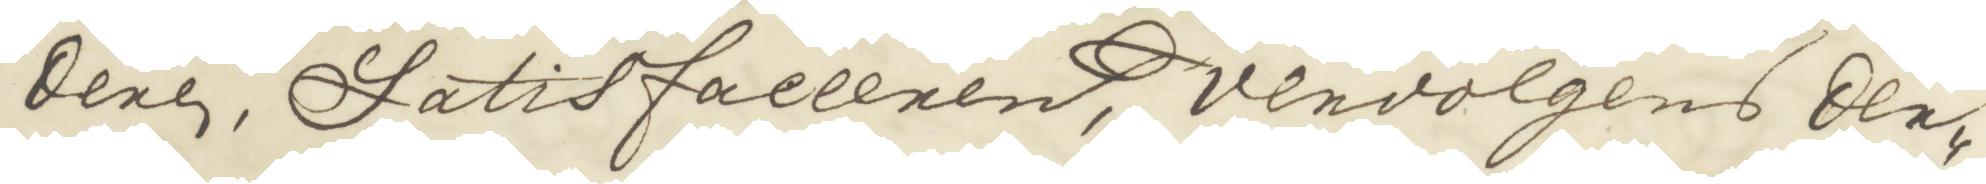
deren, satisfaceeren, vervolgens der„
